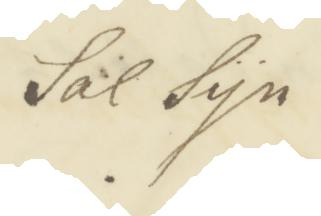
sal sijn
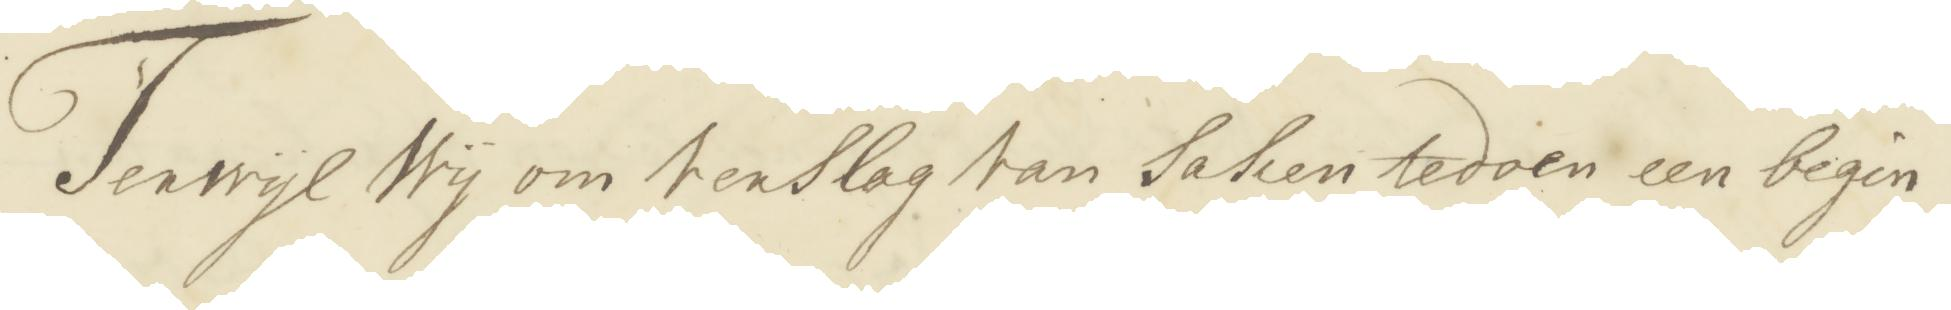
Terwijl wij om verslag van saken te doen een begin
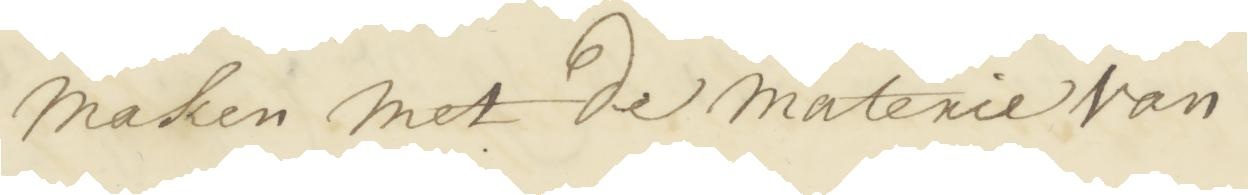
maken met de materie van
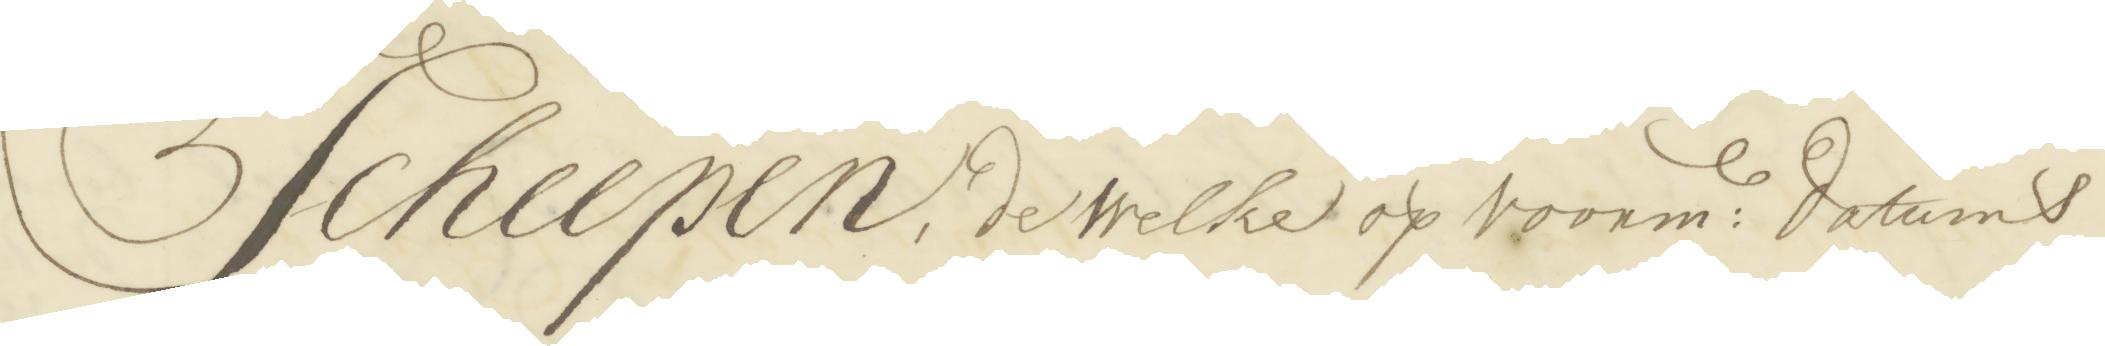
Scheepen, de welke op voorm:e datums
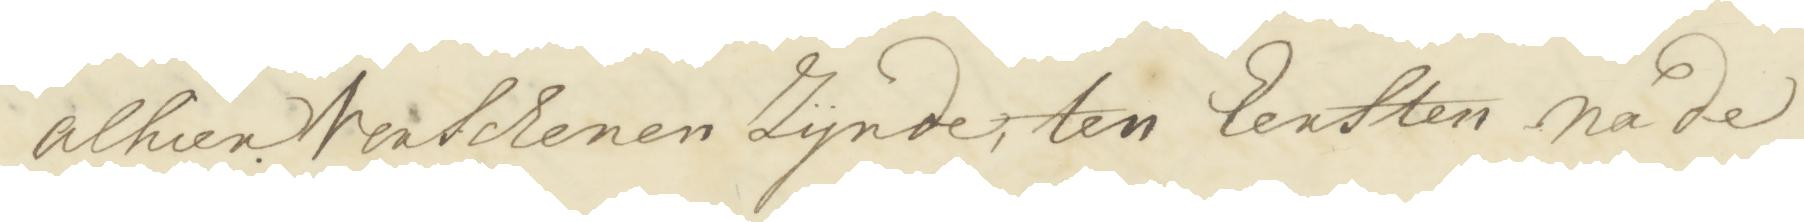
alhier verschenen zijnde, ten Eersten na de
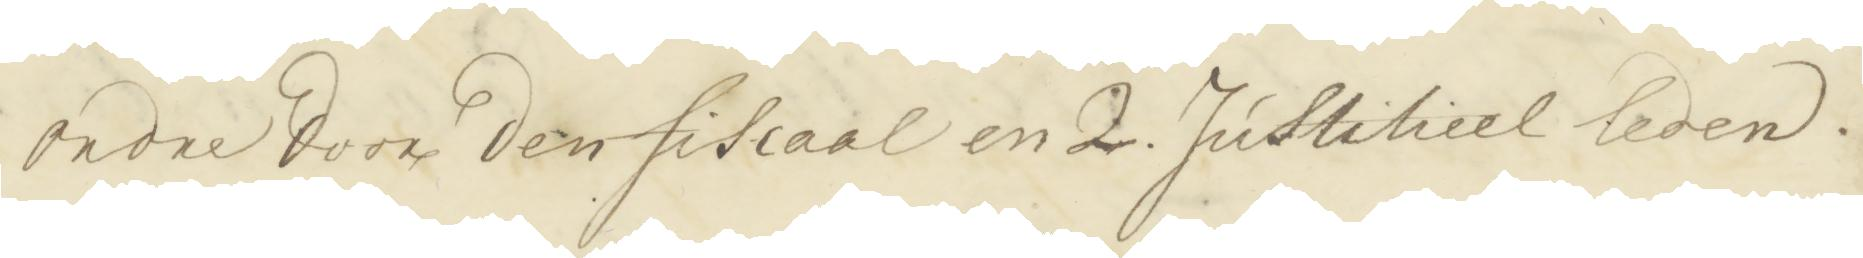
ordre door den fiscaal en 2. Justitieel leden.
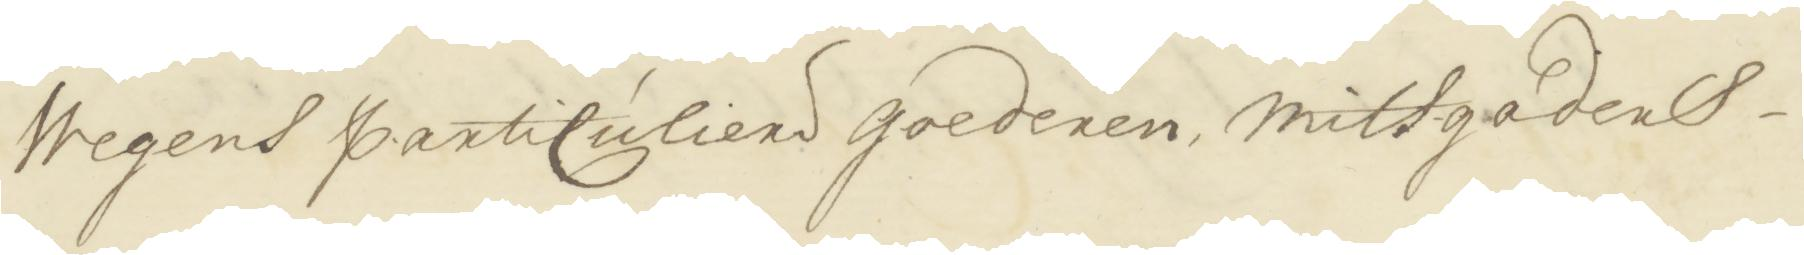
wegens particuliere goederen, mitsgaders -
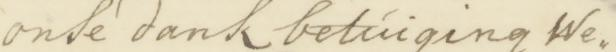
onse dank betuiging we„
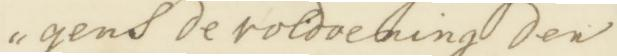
„gens de voldoening der
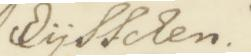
Eijsschen.
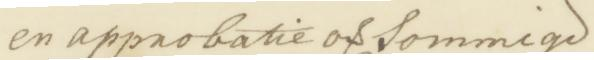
en approbatie over sommige
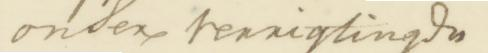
onser verrigtingen
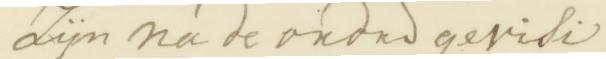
zijn na de ordre gevisi
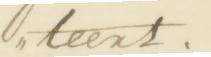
teert.
